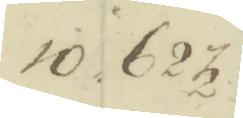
10„62½
